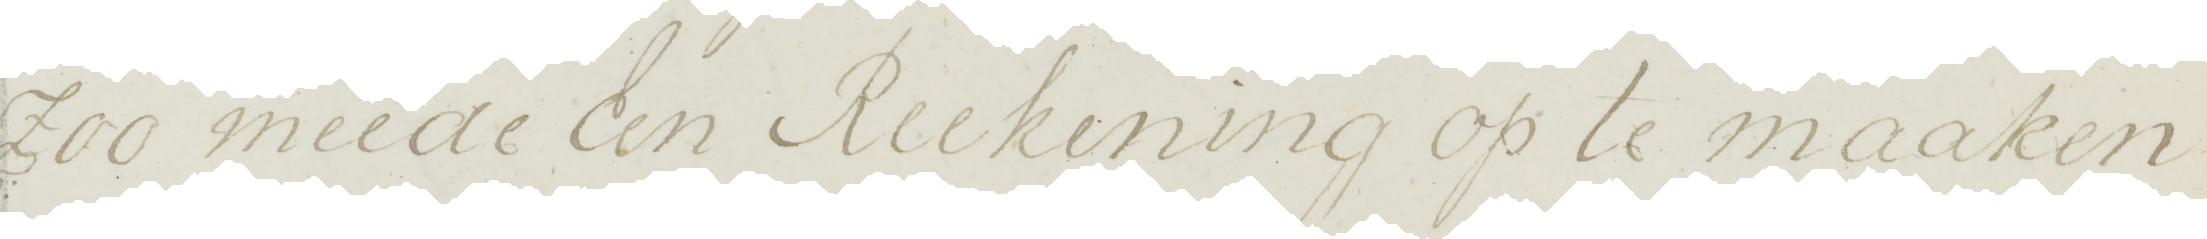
zoo meede Een Reekening op te maaken
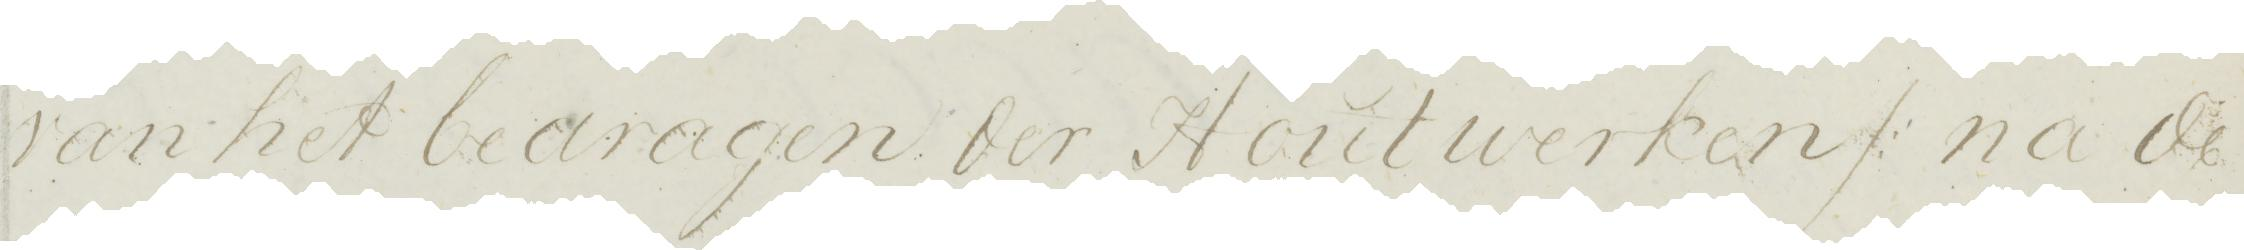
van het bedragen der Houtwerken /: na de
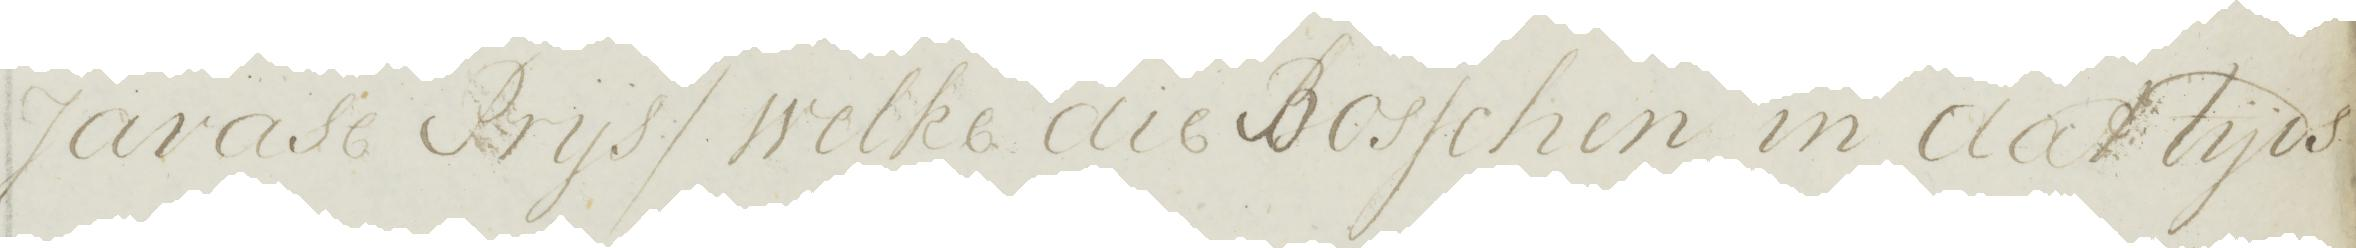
javase Prijs:/ welke die Bosschen in dat tijds
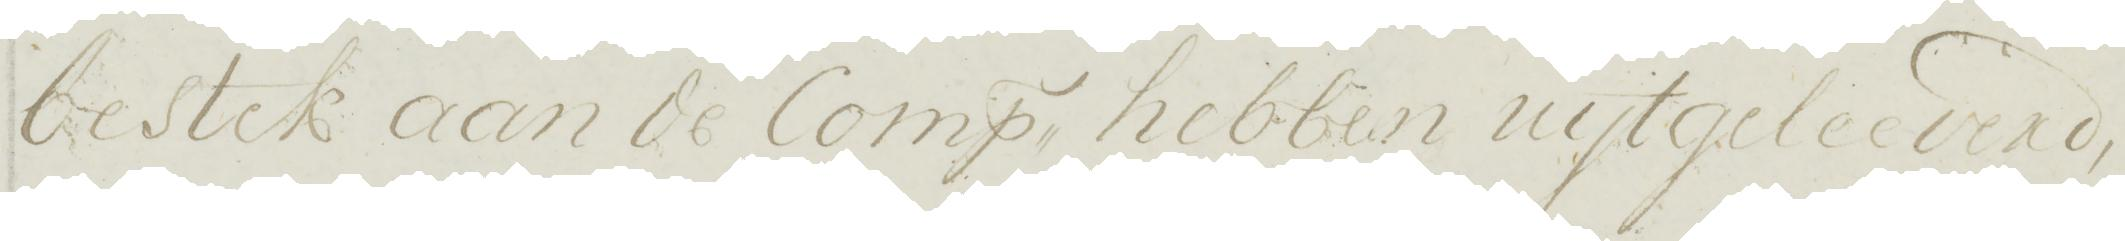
bestek aan de Comp„s hebben uijtgeleeverd,
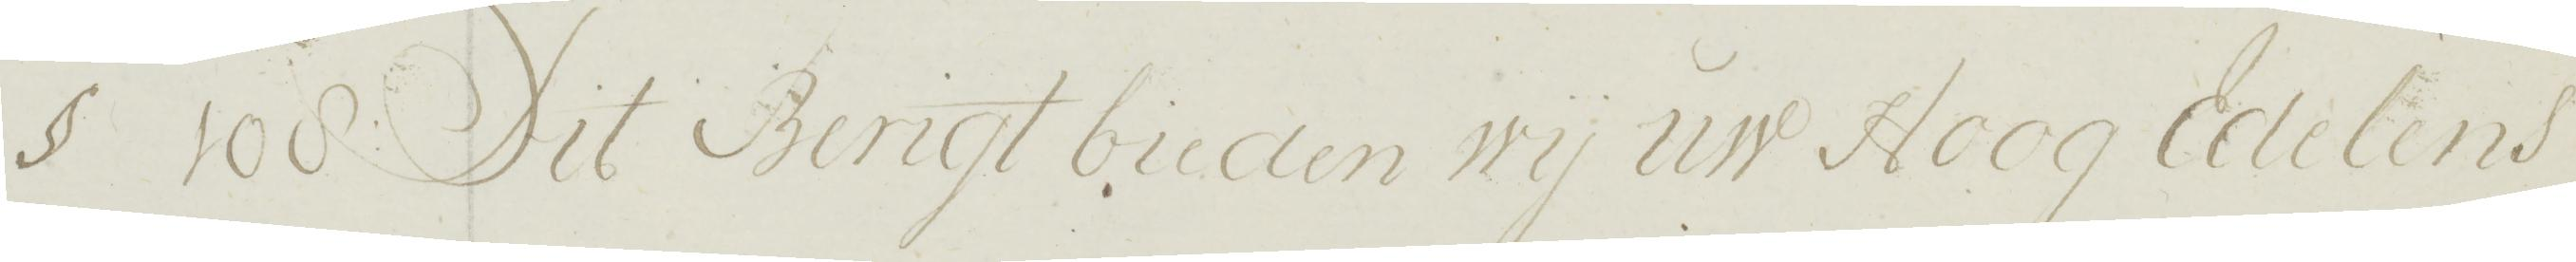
§ 108: Dit Berigt bieden wij uw Hoog Edelens
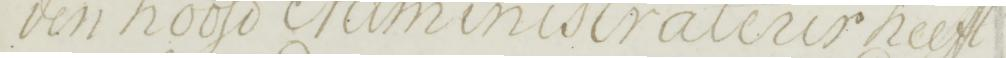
den hoofd Administrateur heeft
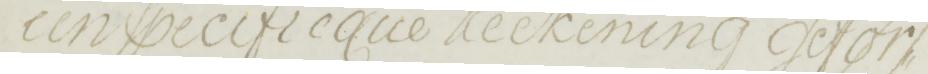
een specificque reekening gefor„
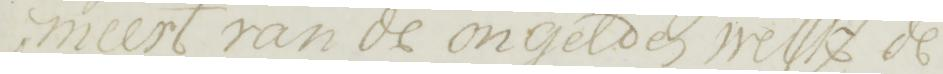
meert van de ongelden welk de
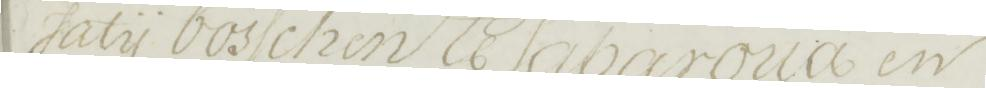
jatij bosschen te Saparoua en
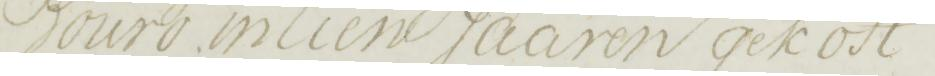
Bouro in tien Jaaren gekost
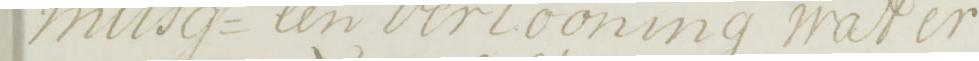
mitsg=s een vertooning wat er
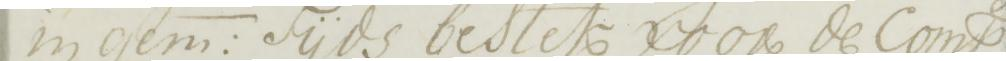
in gem: Tijds bestek voor de Comp:s
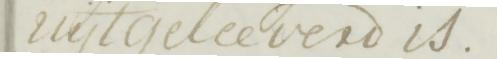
uijtgeleeverd is.
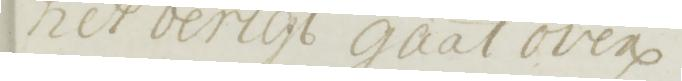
het berigt gaat over
